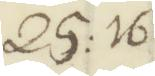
25: 16.
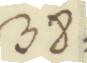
38: 14:
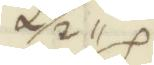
2½
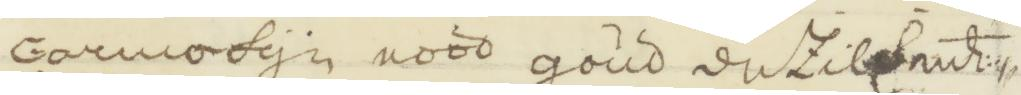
carmosijn rood goud en zilver mh: . „
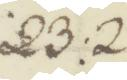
23:2
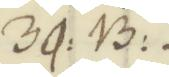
34: 13:
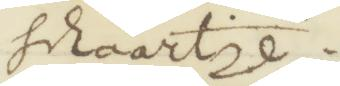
schaartje
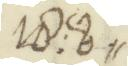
18:8„
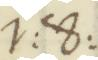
1:8
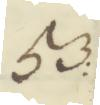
53:
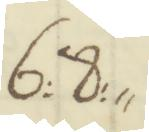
6:8:„
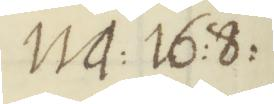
114: 16:8:
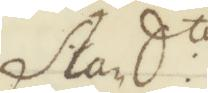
Aan d:to
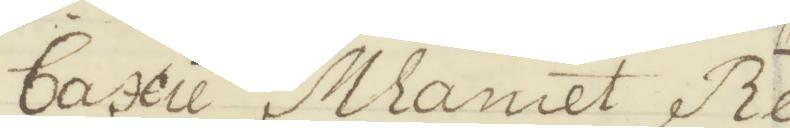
baxie Mhaniet Resa
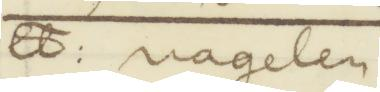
2: lb: nagelen
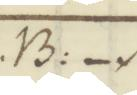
ƒ — .13: –ƒ
